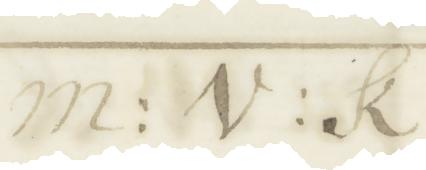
m: v: k
